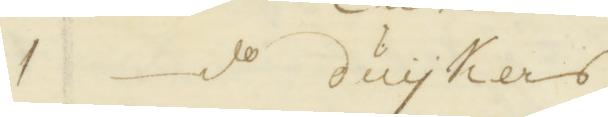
1 do duijkers
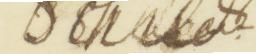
Schild.s
